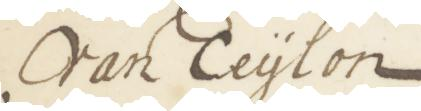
van Ceijlon
